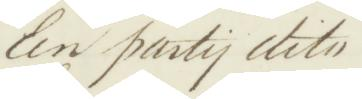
Een partij dito
